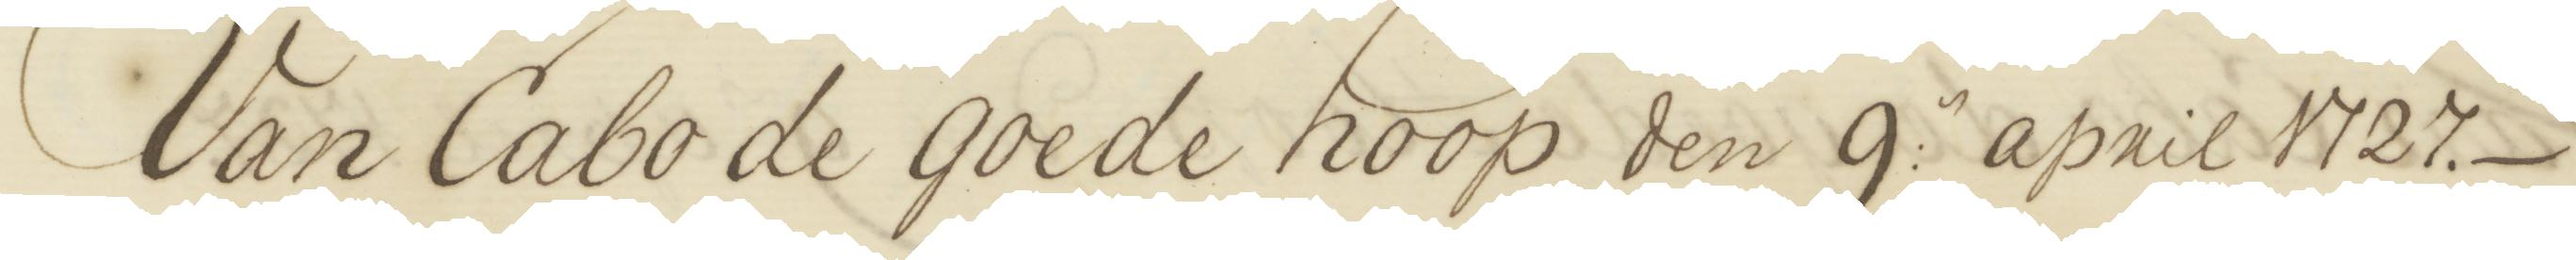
Van Cabo de goede hoop den 9:' april 1727.—
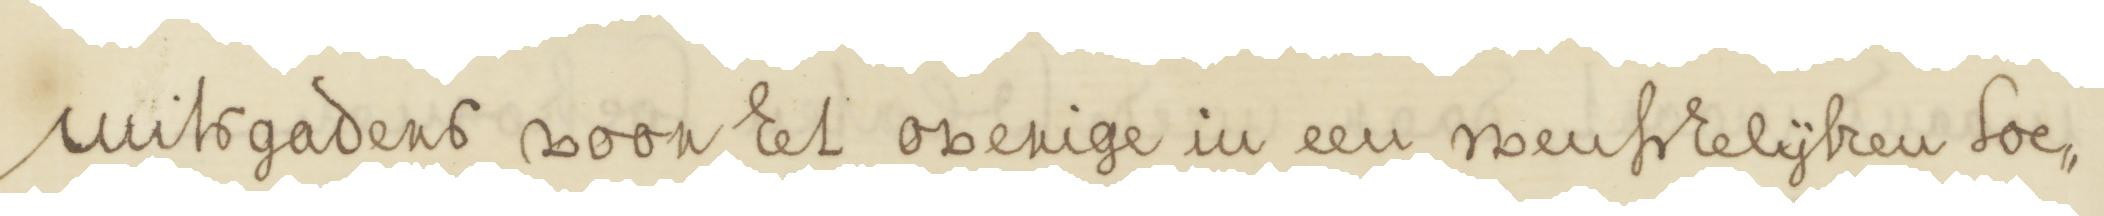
mitsgaders voor het overige in een wenschelijken toe„
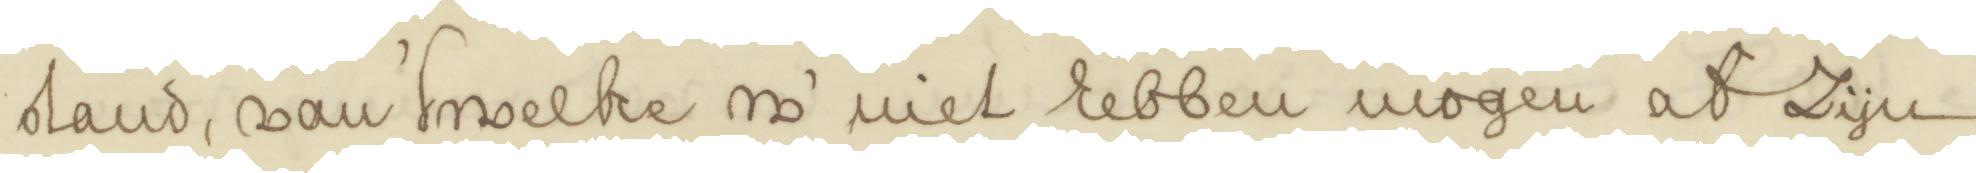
stand, van 'twelke w' niet hebben mogen of zijn
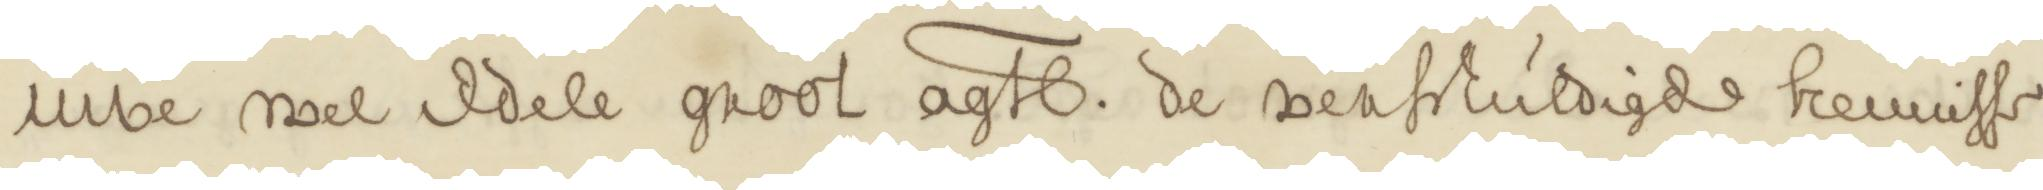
uwe wel Edele groot agtb. de verschuldigde kennisse
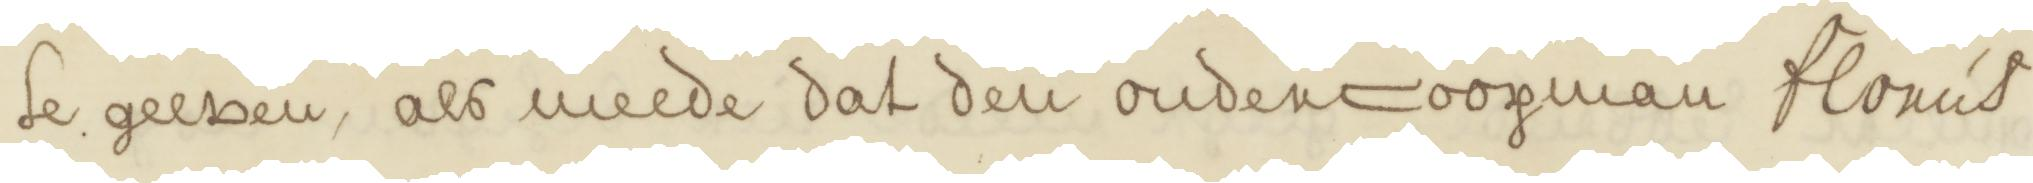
te geeven, als meede dat den ondercoopman florus
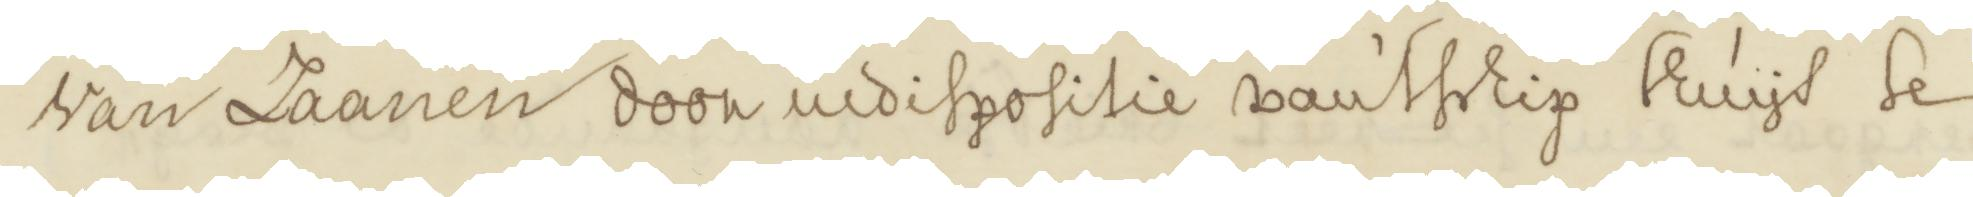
van zaanen door indispositie van 'tschip thuijs te
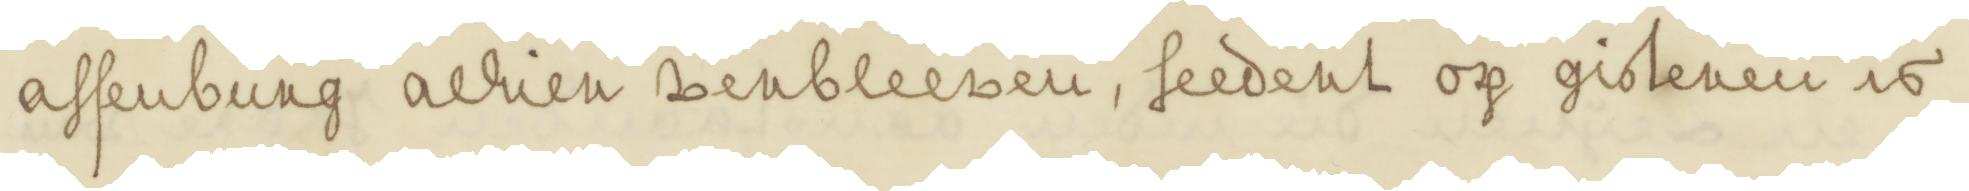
assenburg alhier verbleeven, seedert op gisteren is
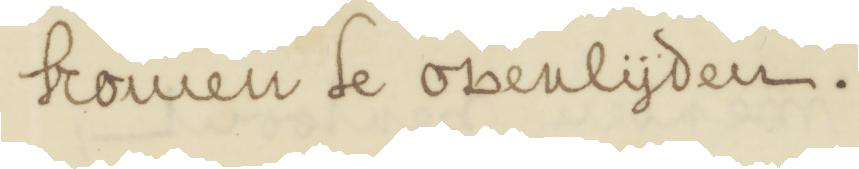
komen te overlijden.
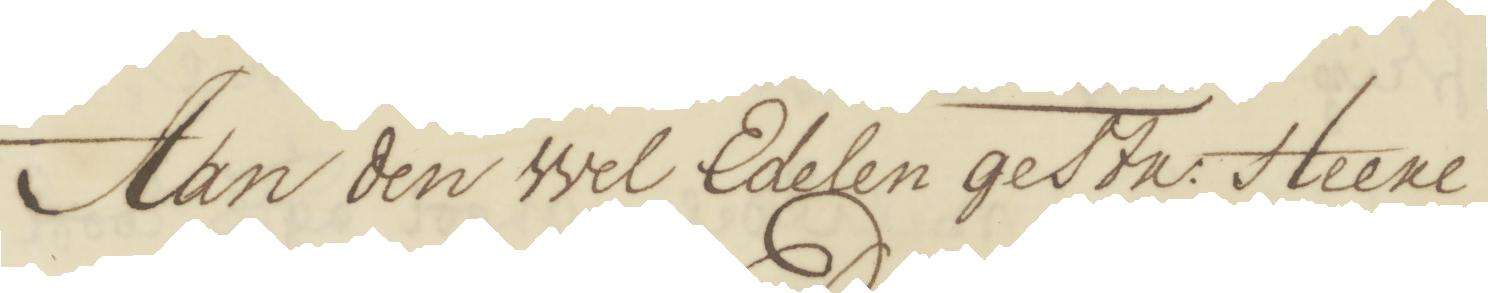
Aan den wel Edelen gestr: Heere
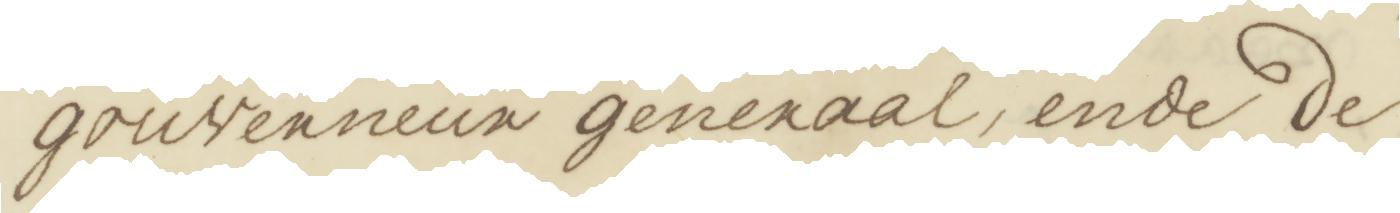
gouverneur generaal, ende de
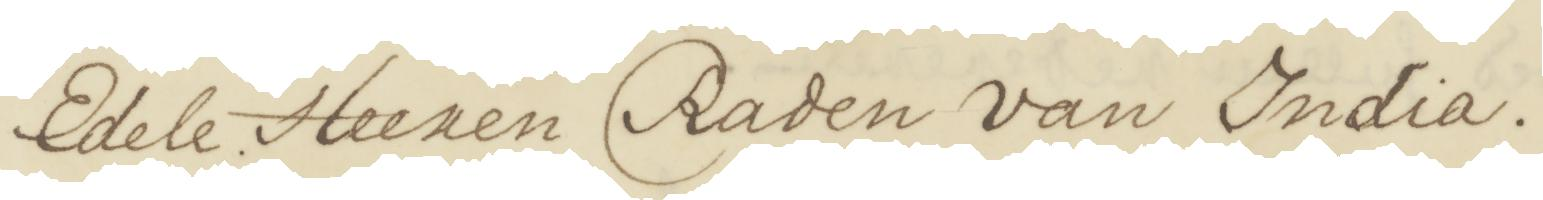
Edele Heeren Raden van India.
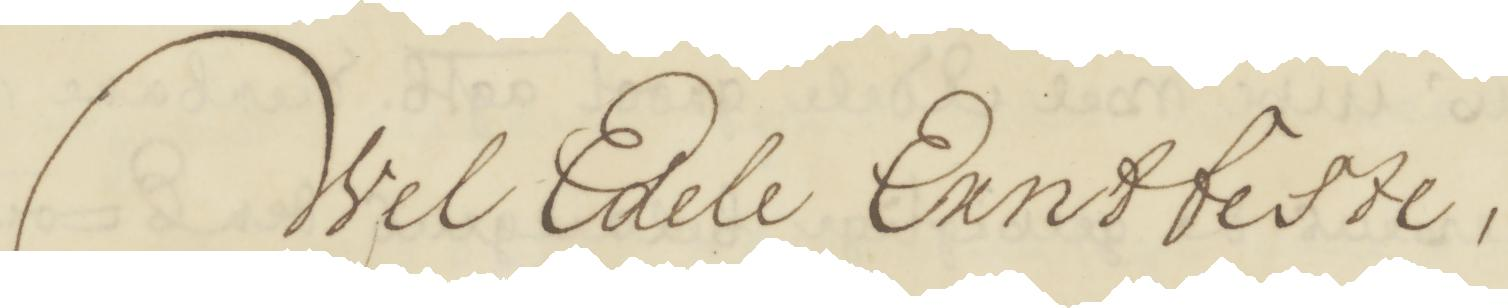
Wel Edele Erntfeste,
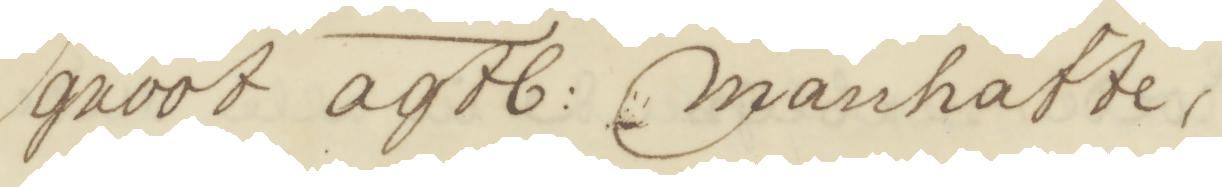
groot agtb: manhafte,
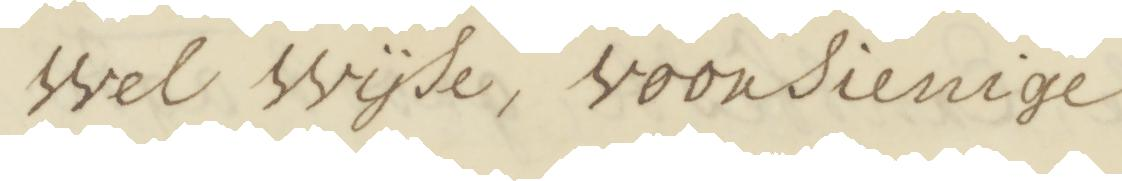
wel wijse, voorsienige
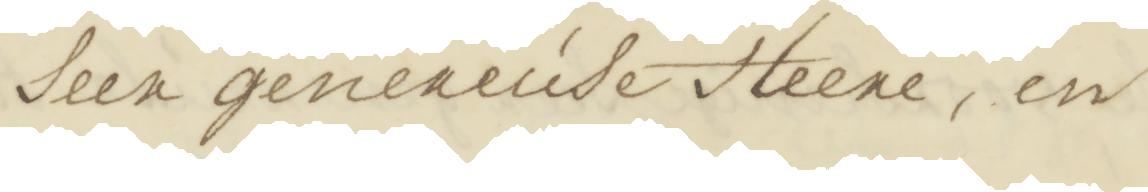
seer genereuse Heere, en
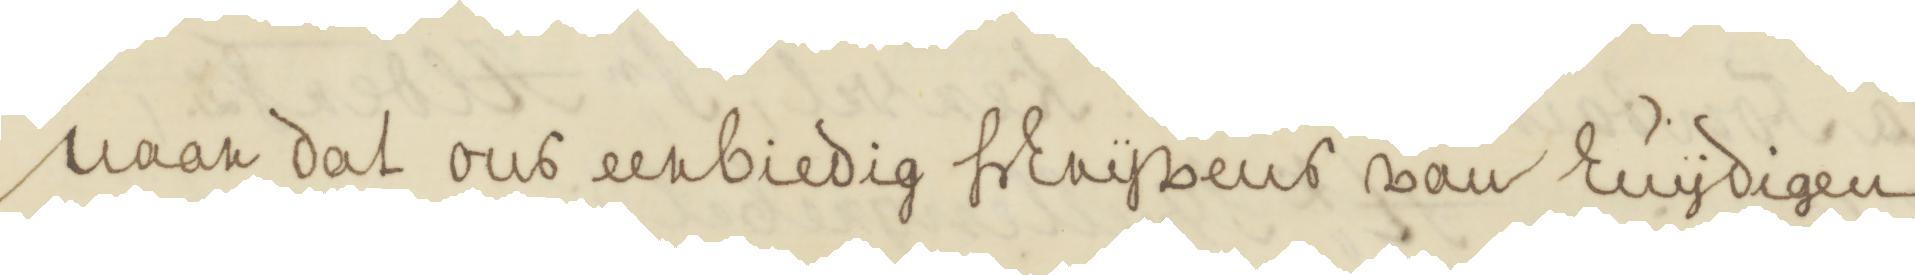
naar dat ons eerbiedig schrijvens van huijdigen
